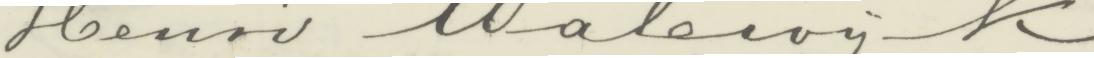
Henri Walewijk
